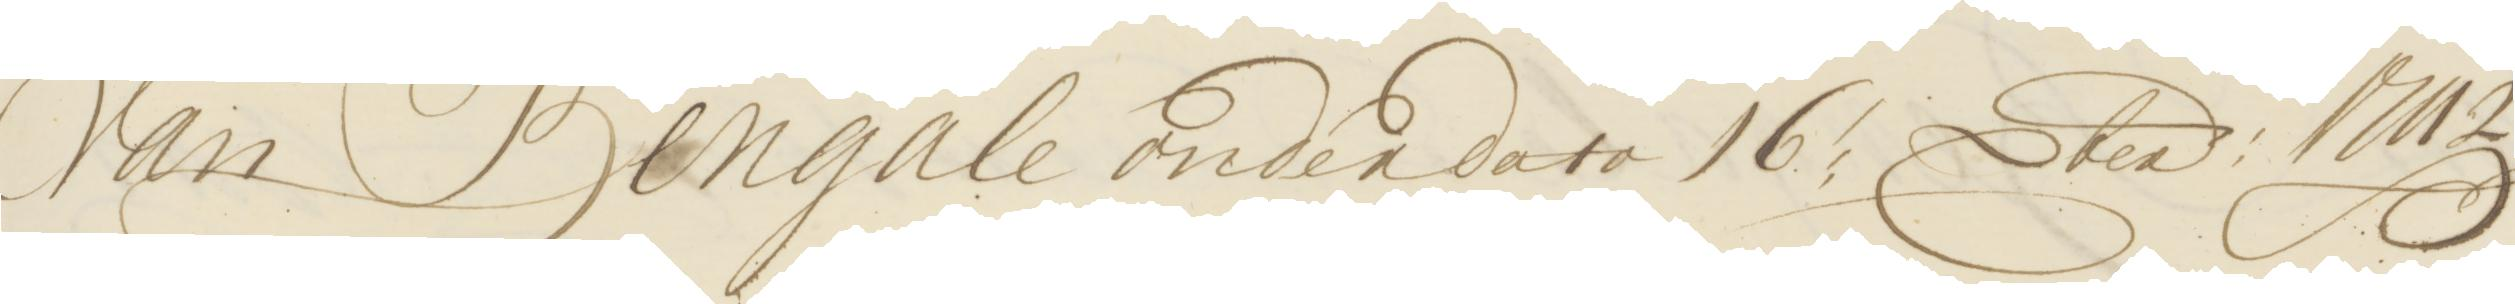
Van Bengale onder dato 16:' xber: 1742.
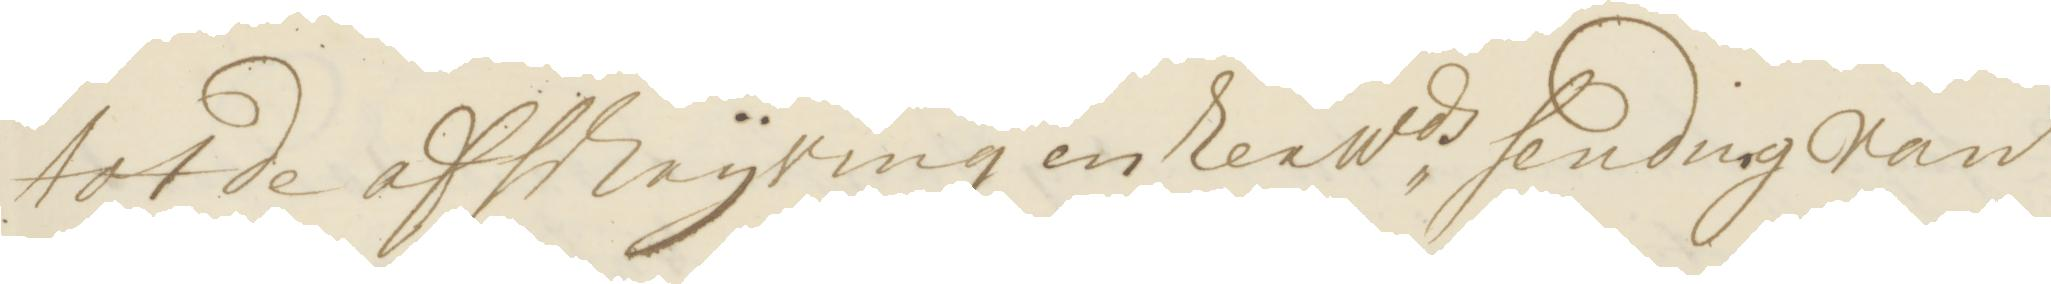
tot de afschrijving en herw„ds sending van
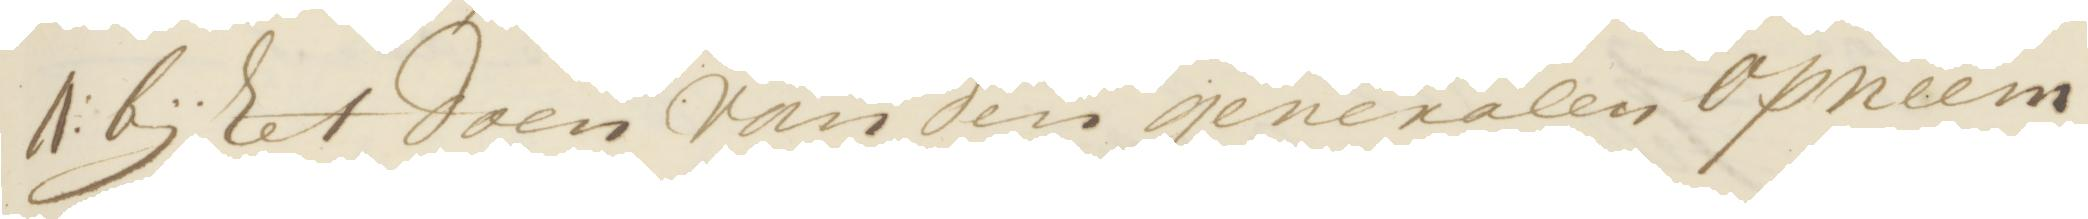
4: bij het doen van den generalen opneem
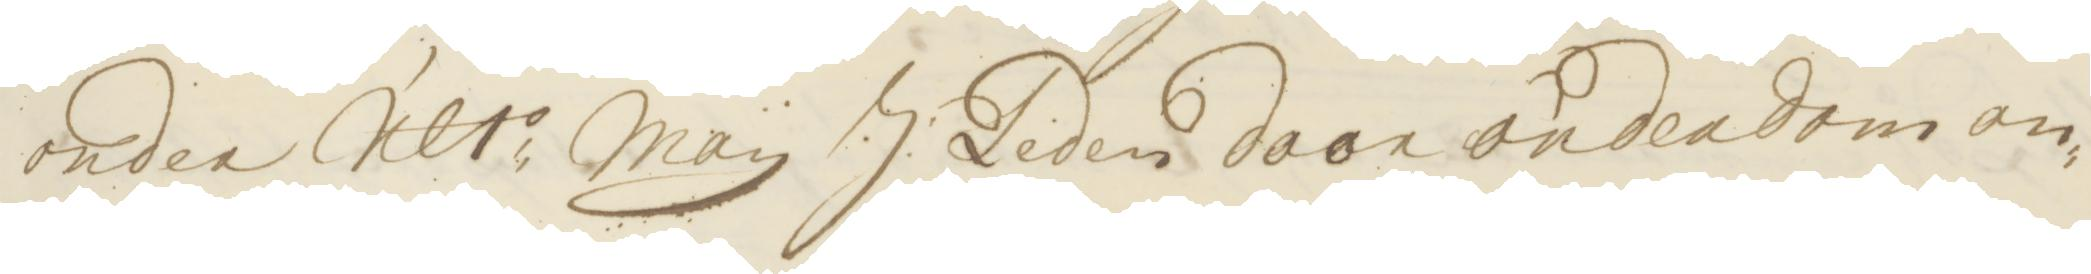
onder ult„o maij J: Leden door ouderdom on„
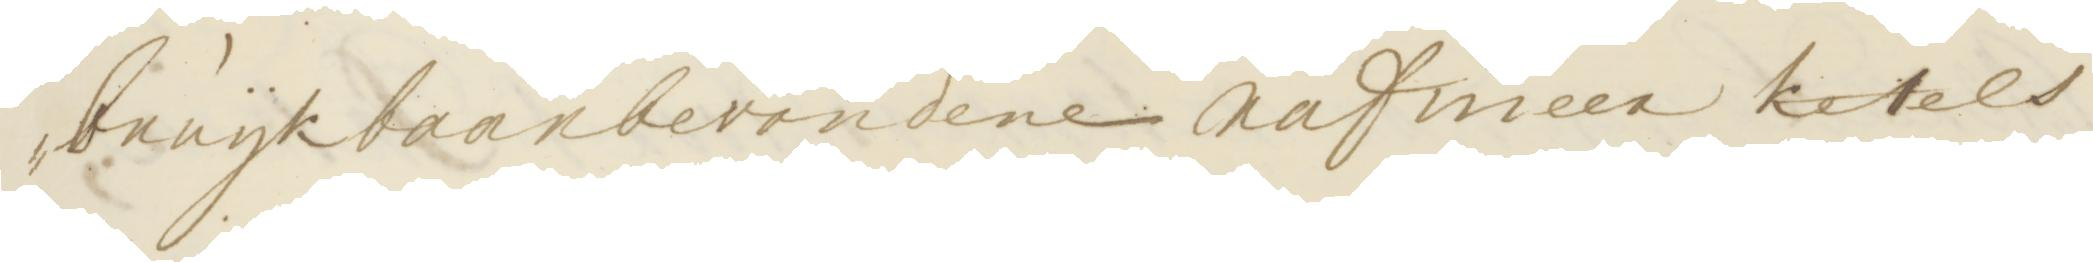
„bruijkbaar bevondene rafineer ketels
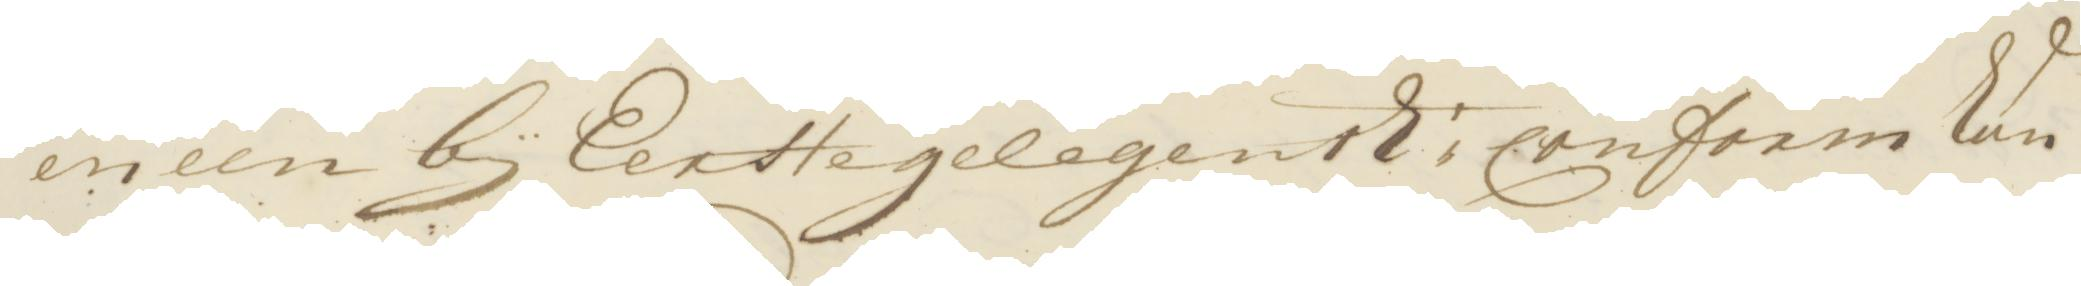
en een bij Eerste gelegenth„t conform hun
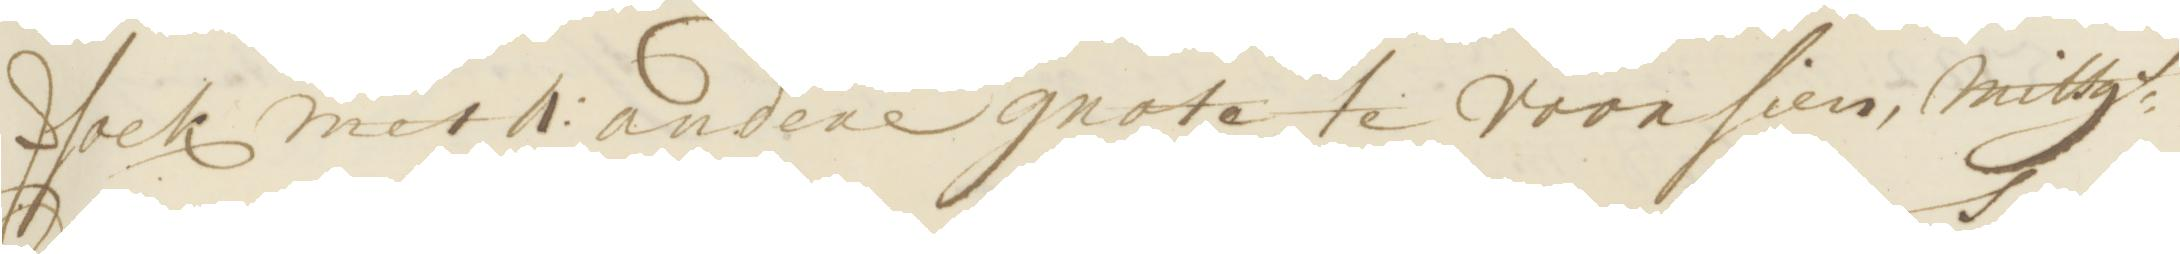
versoek met 4: andere grote te voorsien, mitsg„s
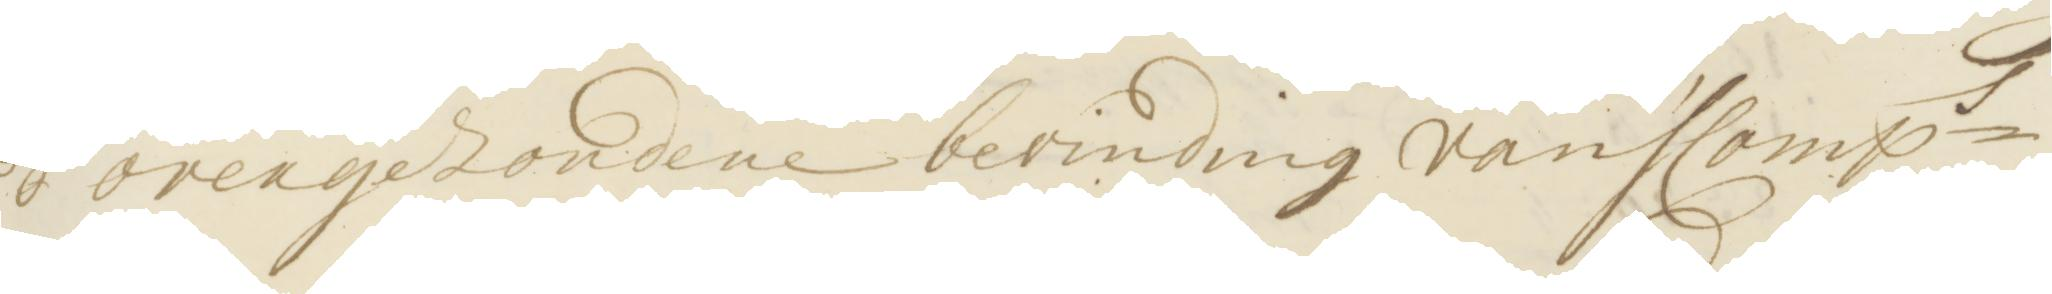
d' overgezondene bevinding van 'sComp=s
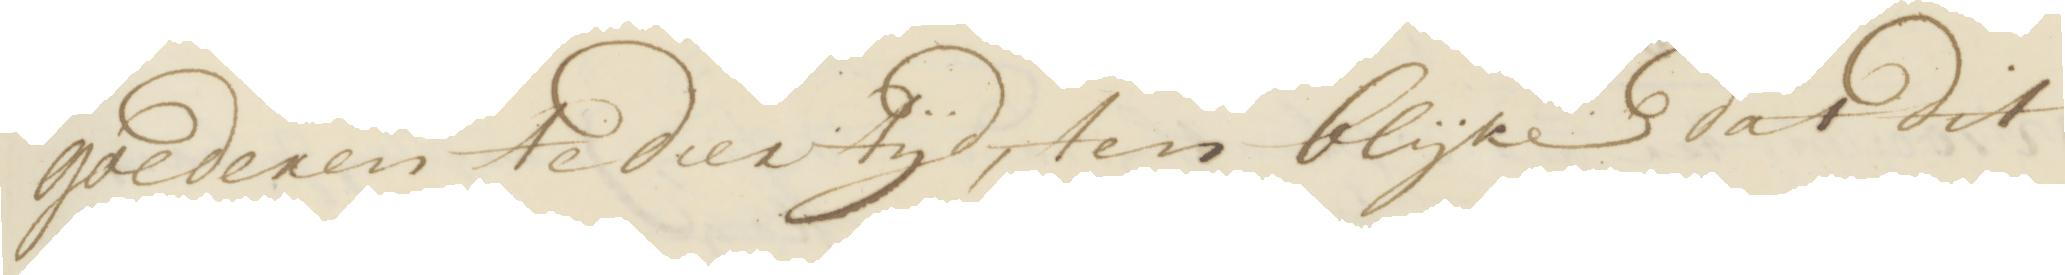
goederen te dier tijd, ten blijke dat dit
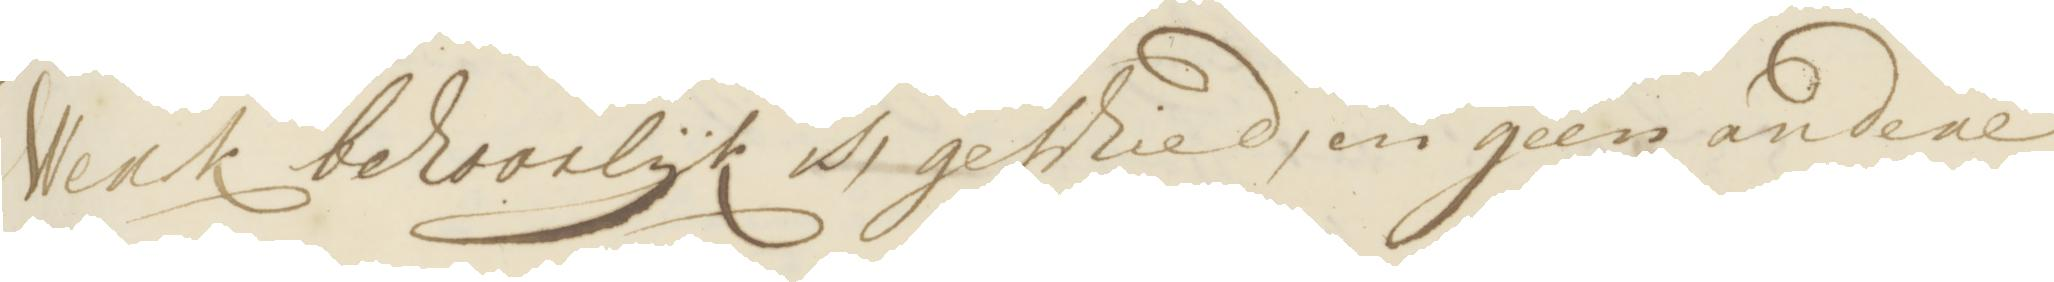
Werk behoorlijk is, geschied, en geen andere
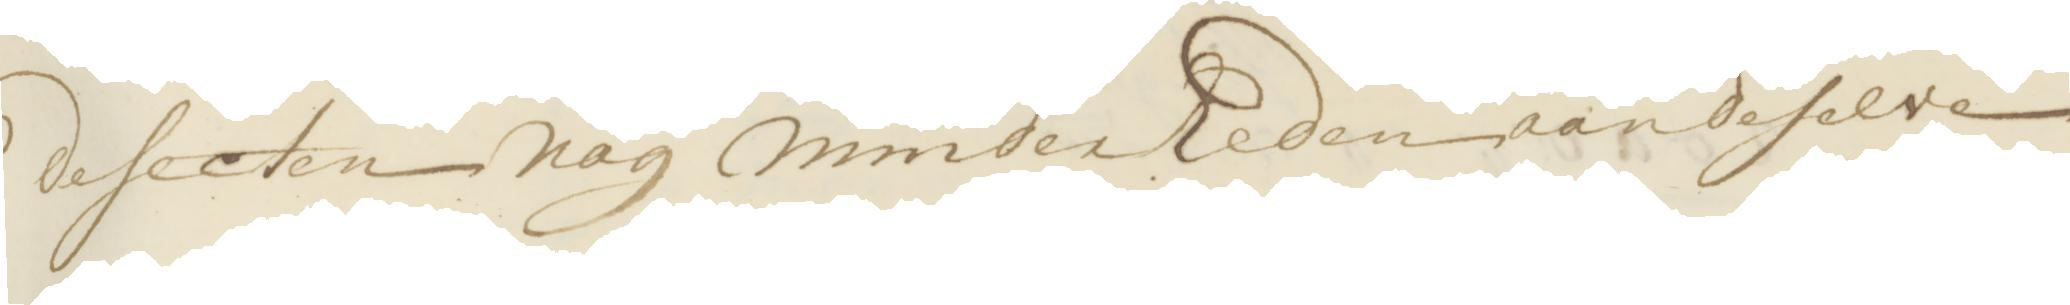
defecten nog minderheden aan deselve
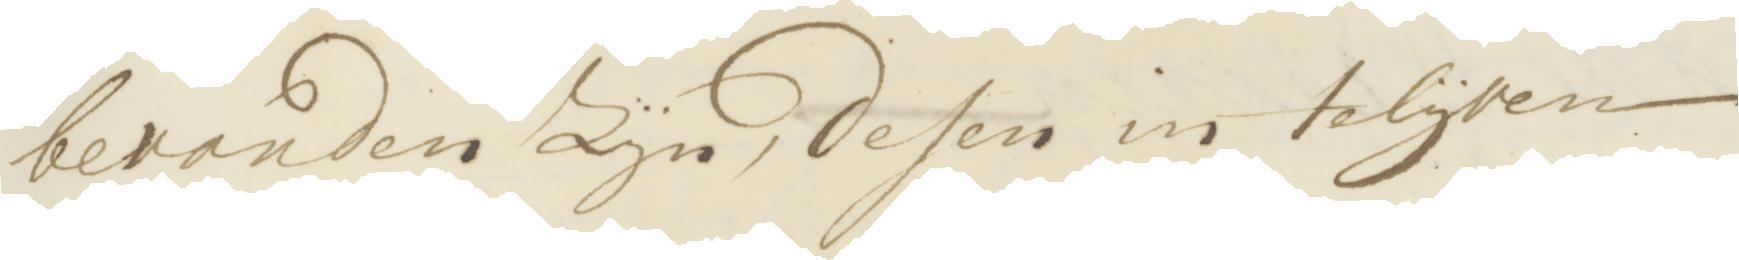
bevonden Zijn, desen in te lijven
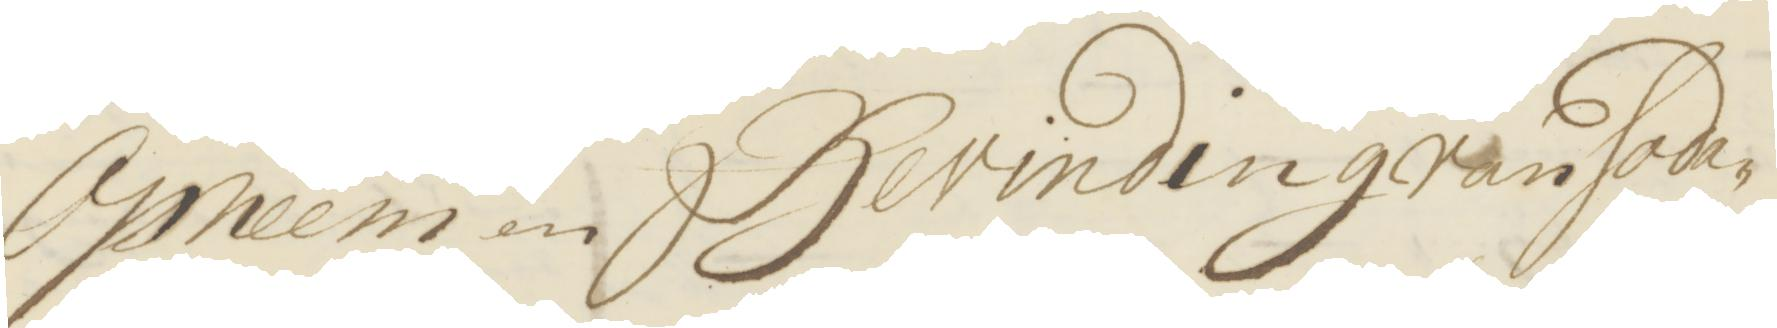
Opneem en Bevinding van Soda„
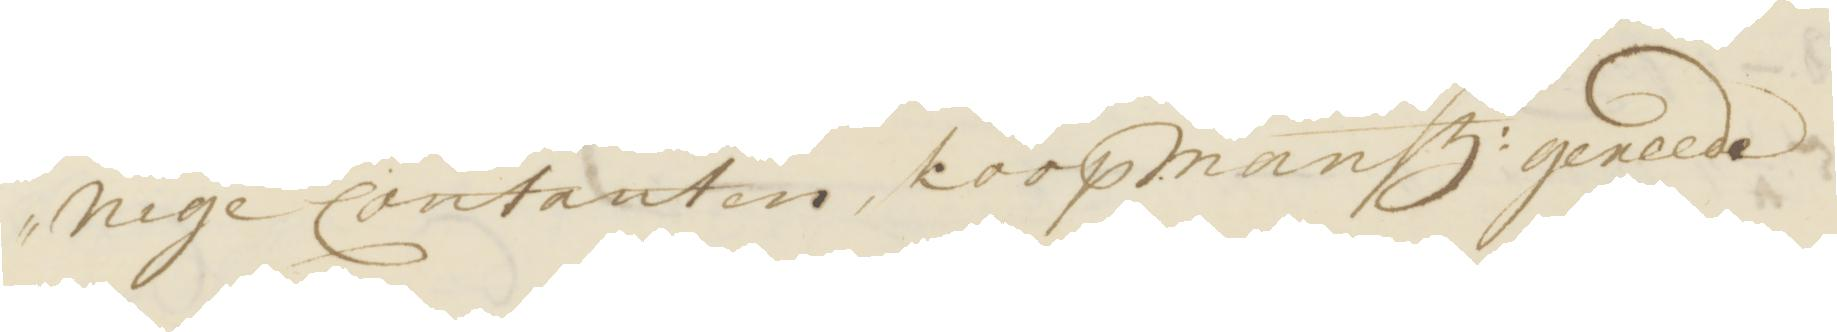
„nige contanten, koopmansz: gereede
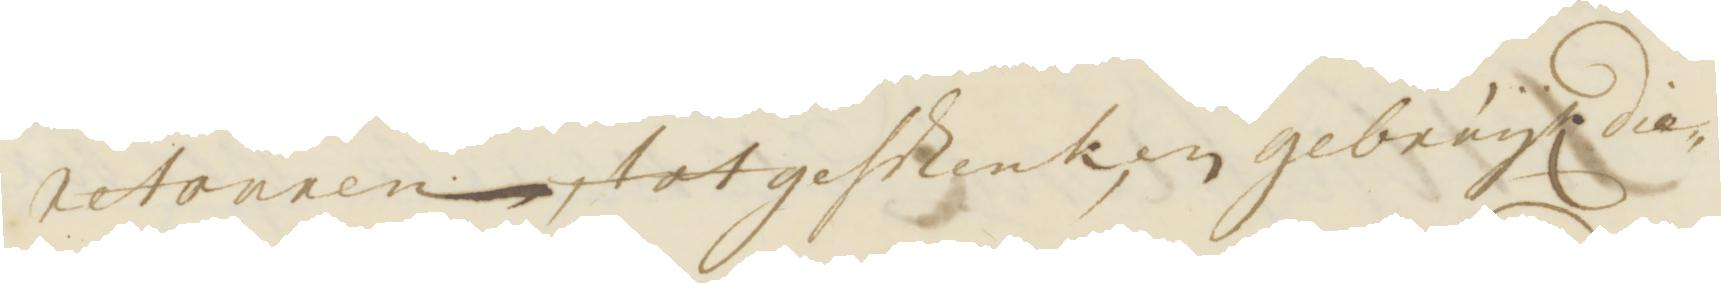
retouren, tot geschenk, en gebruijk die„
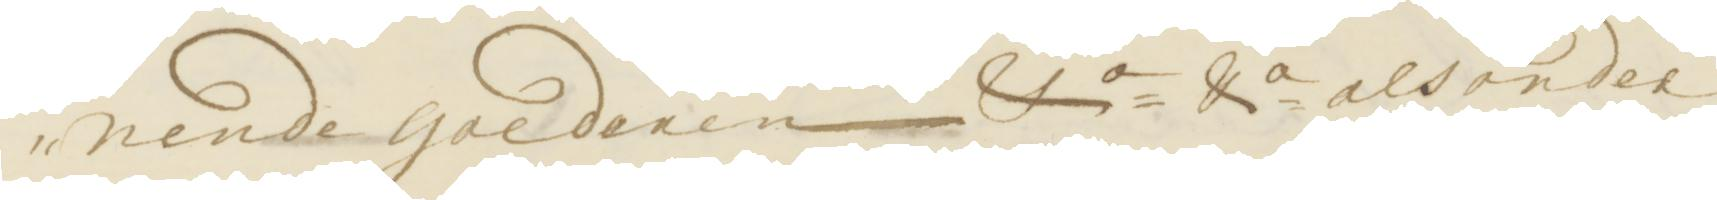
„nende goederen &=a &=a als onder
